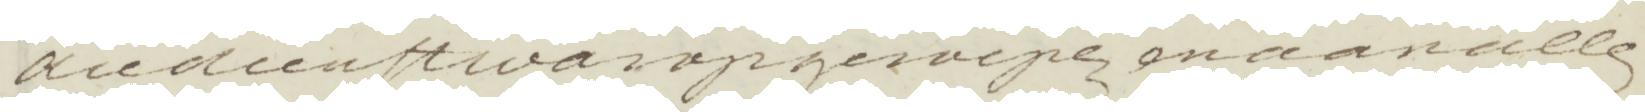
die dienst was op geroepen en aan alle
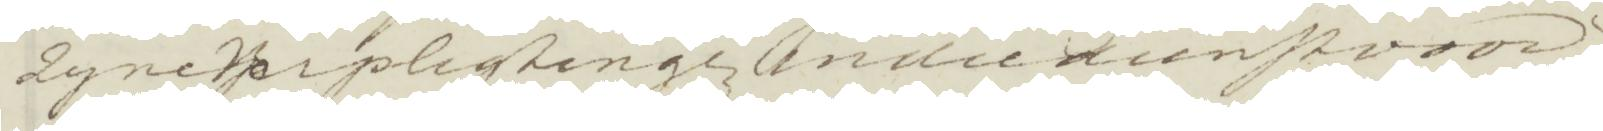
zyne verpligtingen in die dienst voor
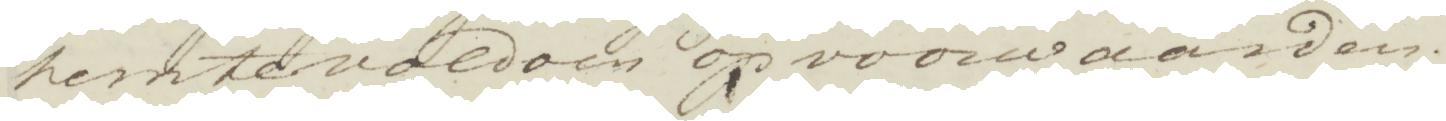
hem te voldoen op voorwaarden.
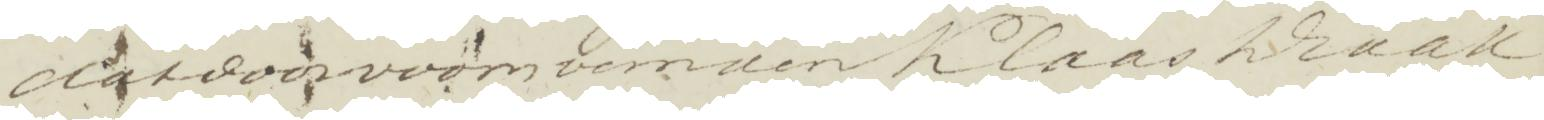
dat door voornoemden Klaas Draak
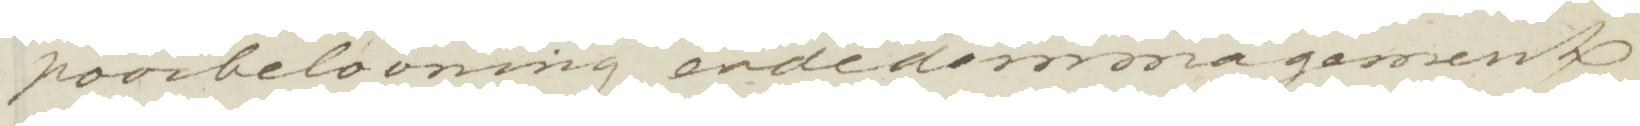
voor belooning ende dommagement
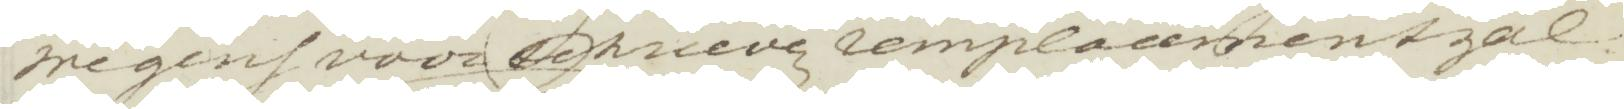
wegens voorschreeven remplacement zal
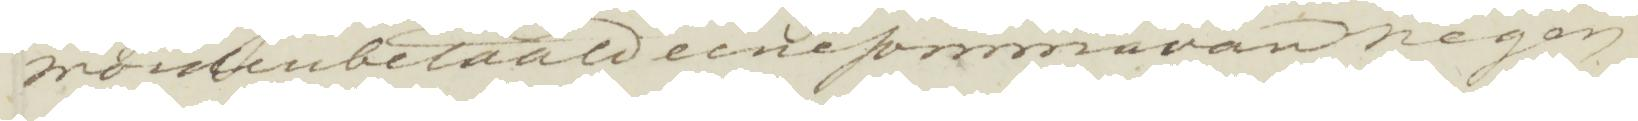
worden betaald eene somma van negen
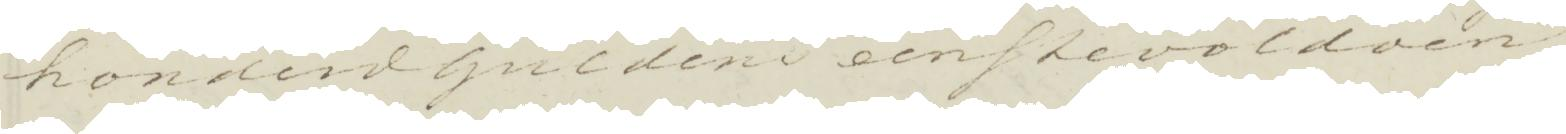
honderd Guldens eens te voldoen
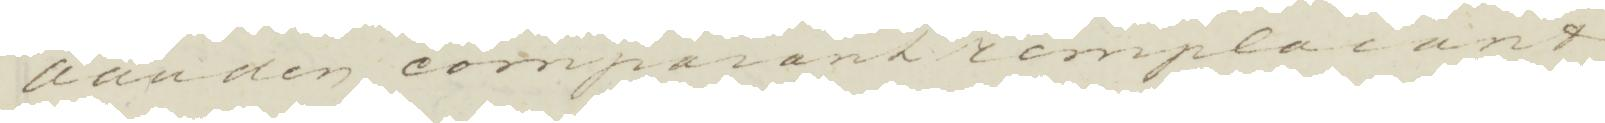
aan den comparant remplacant
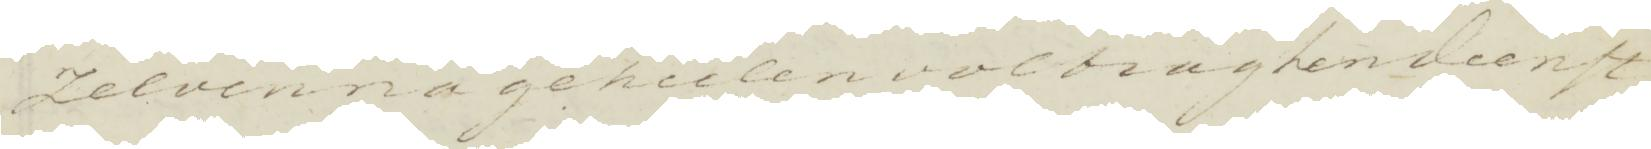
zelven na geheelen volbragten dienst
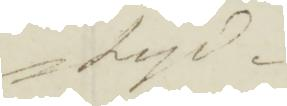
=zyde
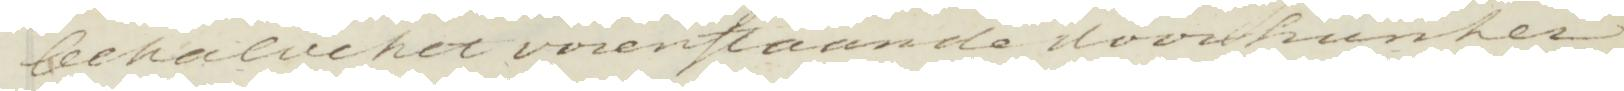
behalve het vorenstaande door hun ter
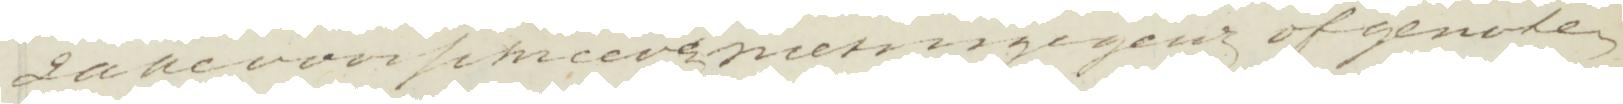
zake voorschreeven niets is gegeven of genoten
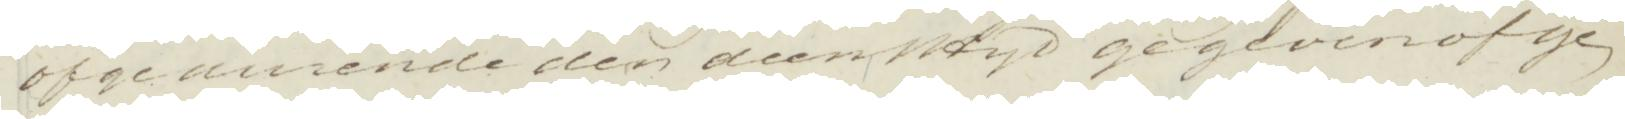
of gedurende den diensttyd gegeven of ge
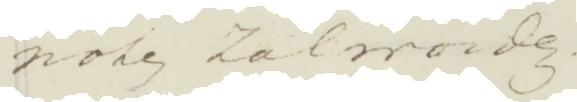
note zal worden
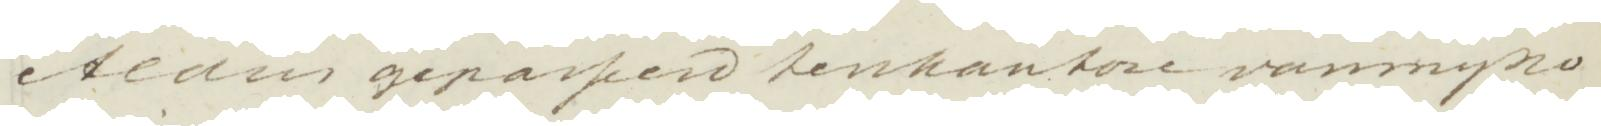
Aldus gepasseerd ten kantore van my no
